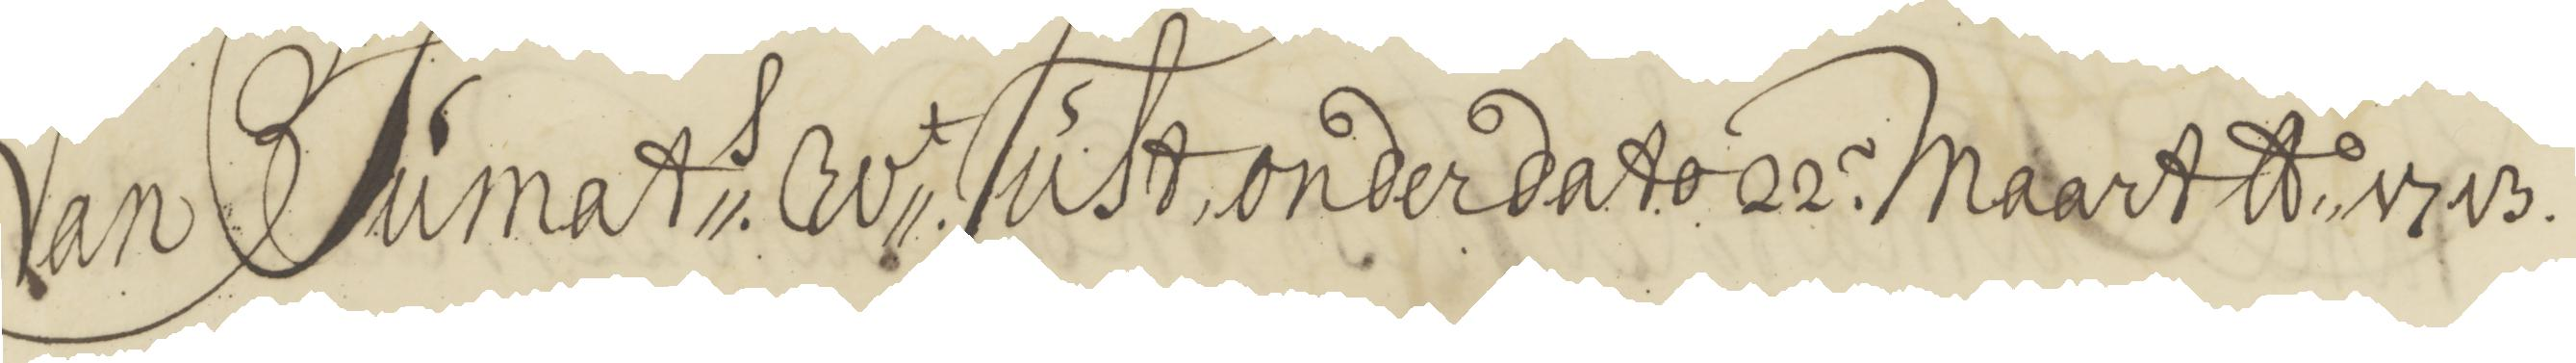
Van Sumat„s w„t Cust, onder dato 22.e Maart A„o 1713.
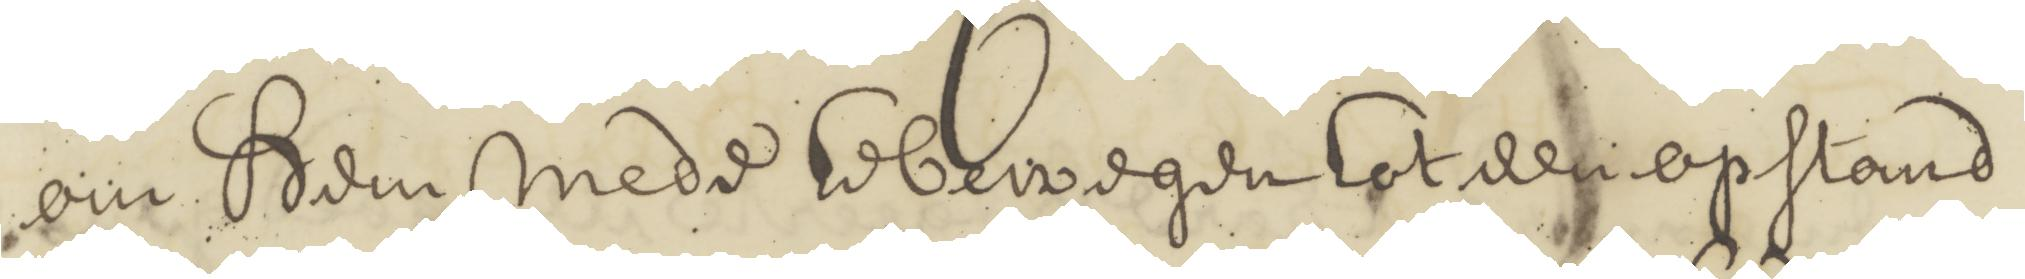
om Hem mede tebewegen tot een opstand
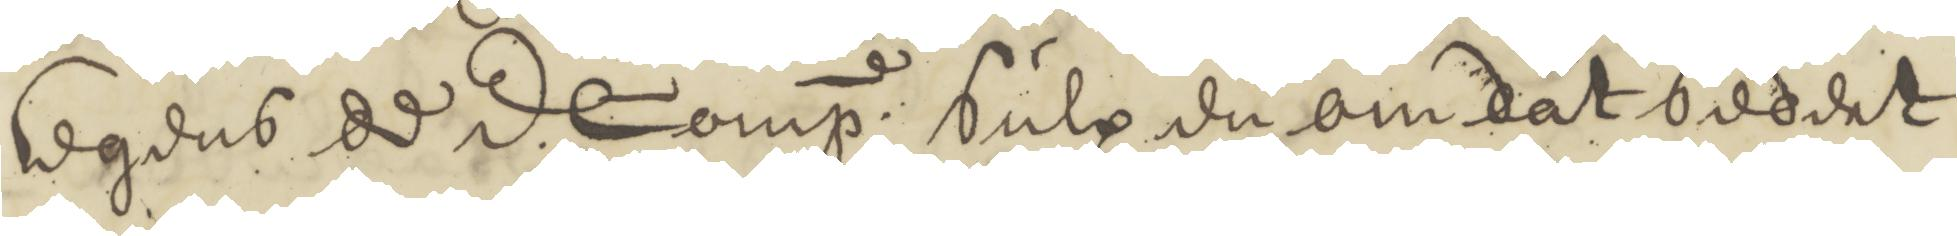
tegens de E. Comp:e sulx en om dat sedert
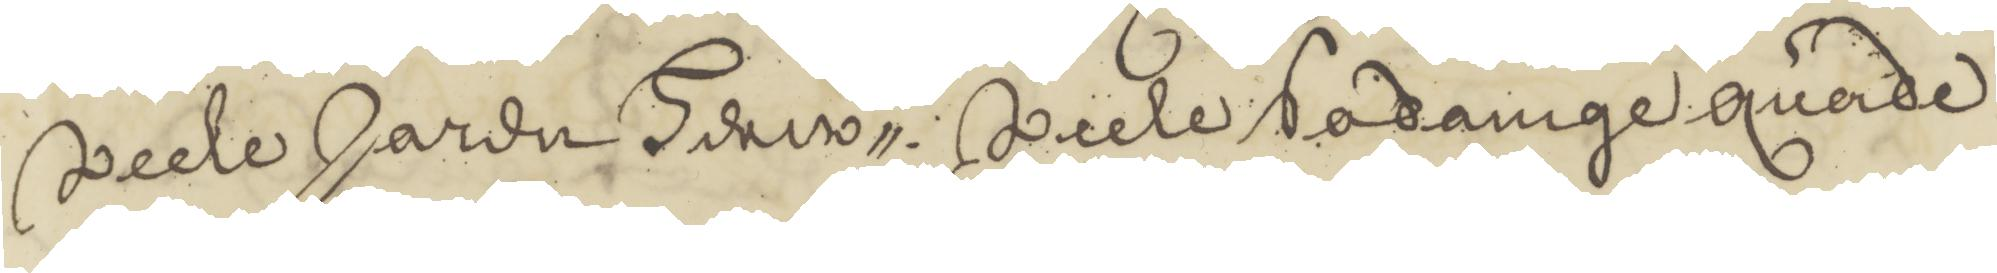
veele Jaren herw„ts. veele sodanige quade
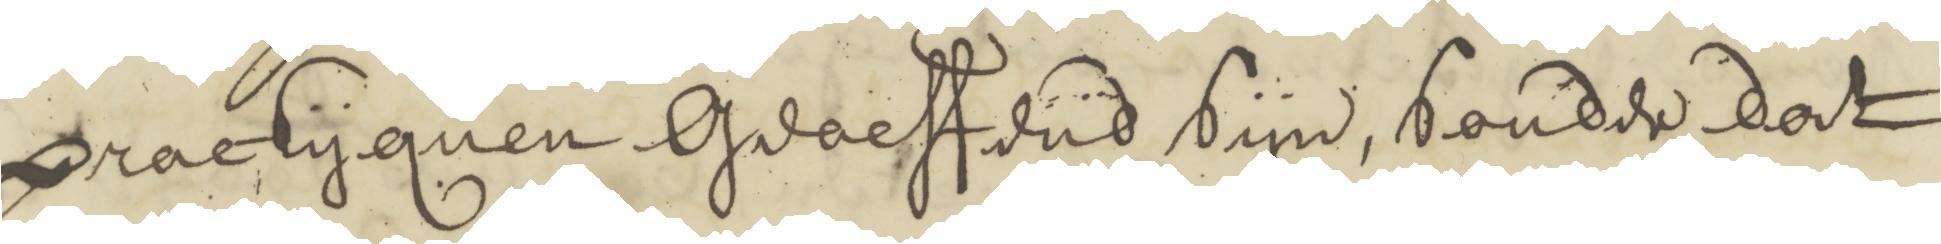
practijquen geoeffend sijn, sonder dat
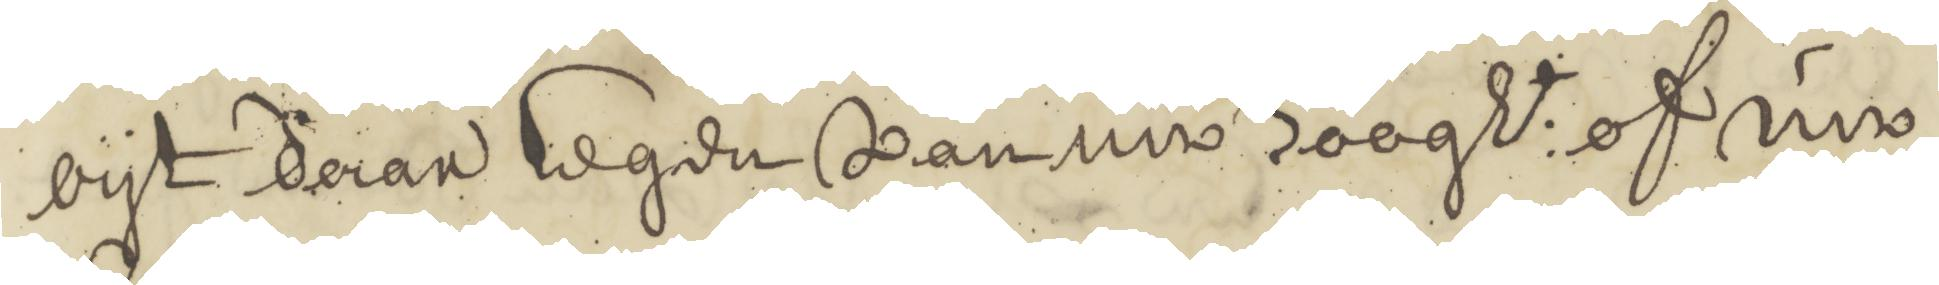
uijt daar tegen van uw hoogh:t of uw
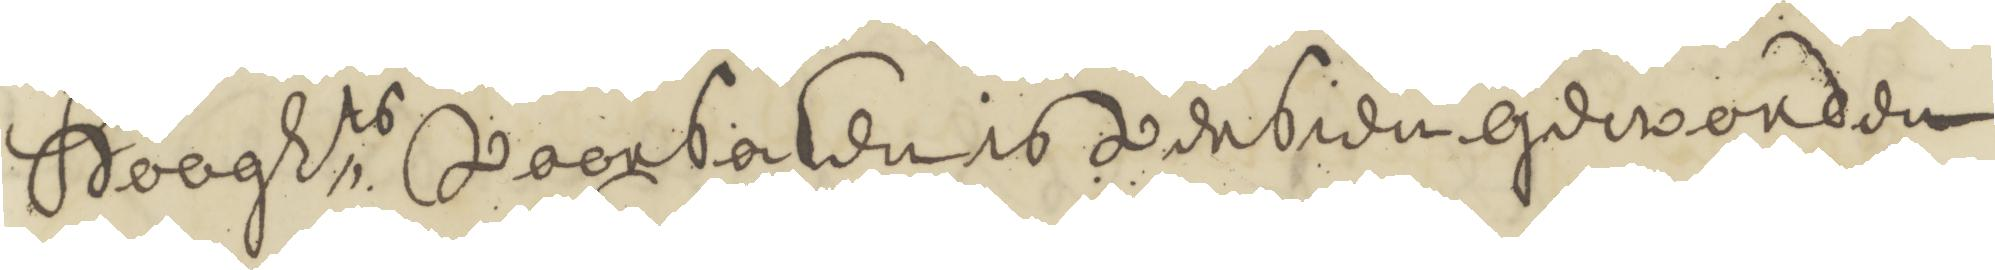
Hoogh„ts voorsaten is versien geworden
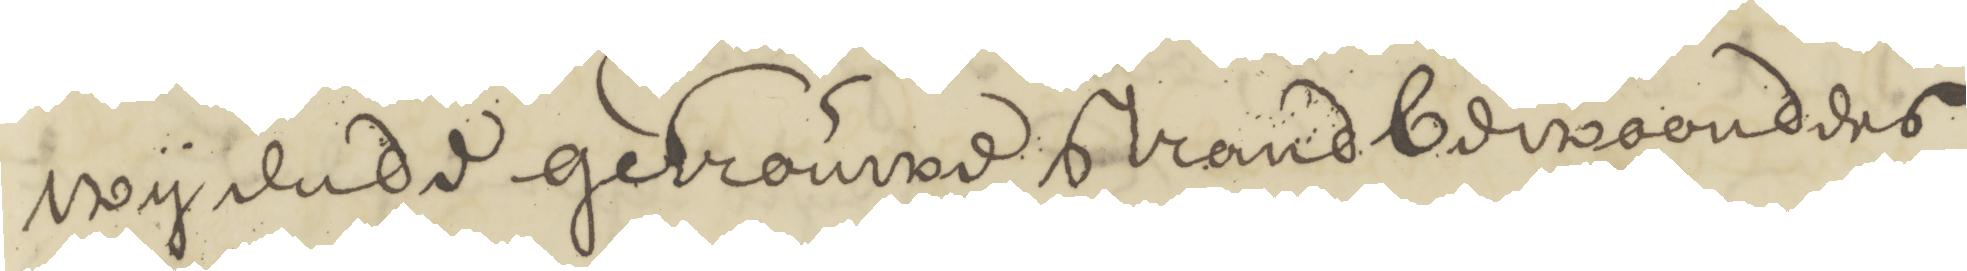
wij ende getrouwe strand bewoonders
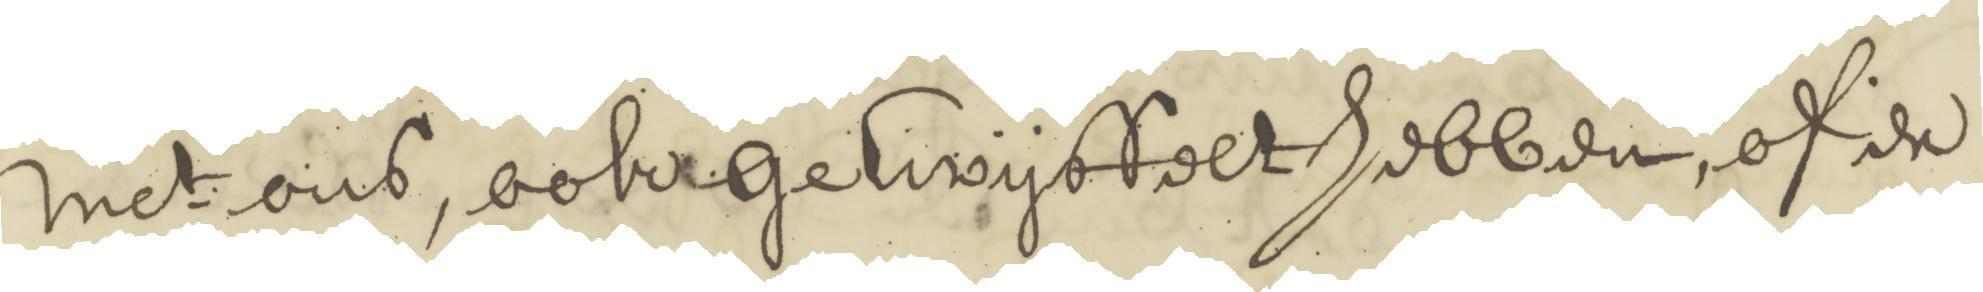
met ons , ook getwijffelt hebben, of er
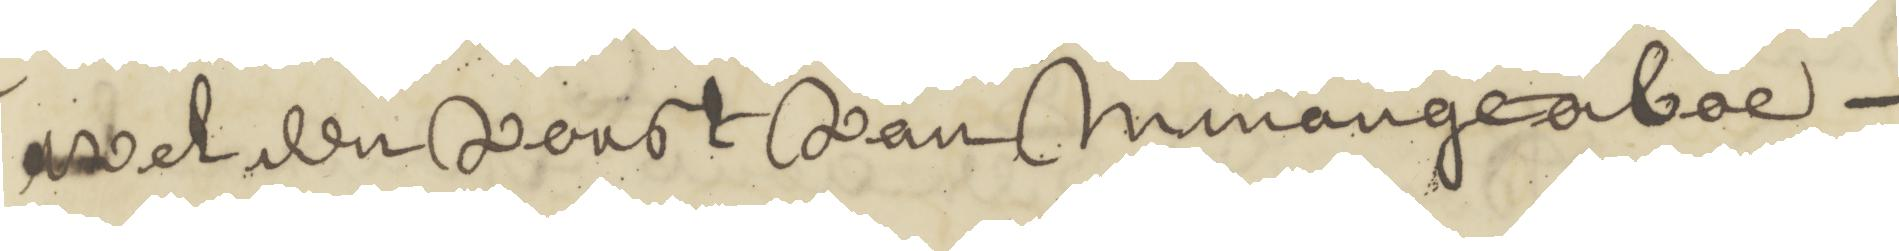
wel een vorst van minangcaboe —
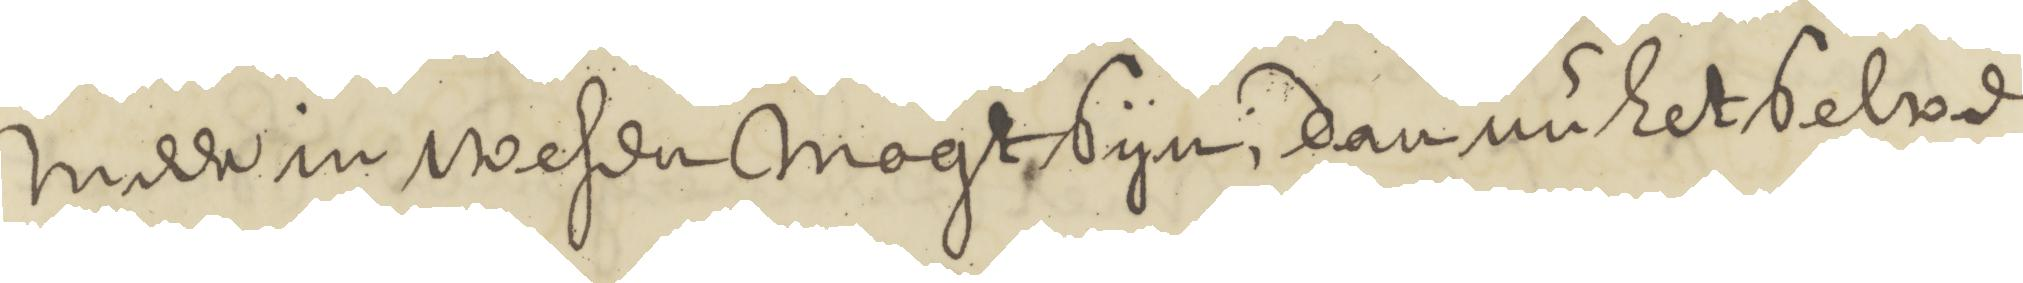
meer in wesen mogt sijn, dan nu het selve
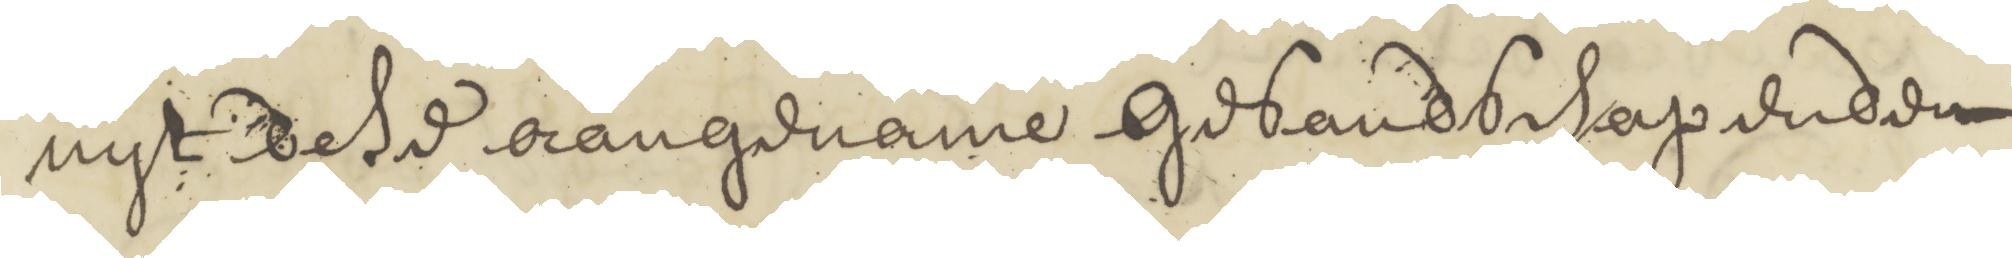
uijt dese aangename gesandschap enden
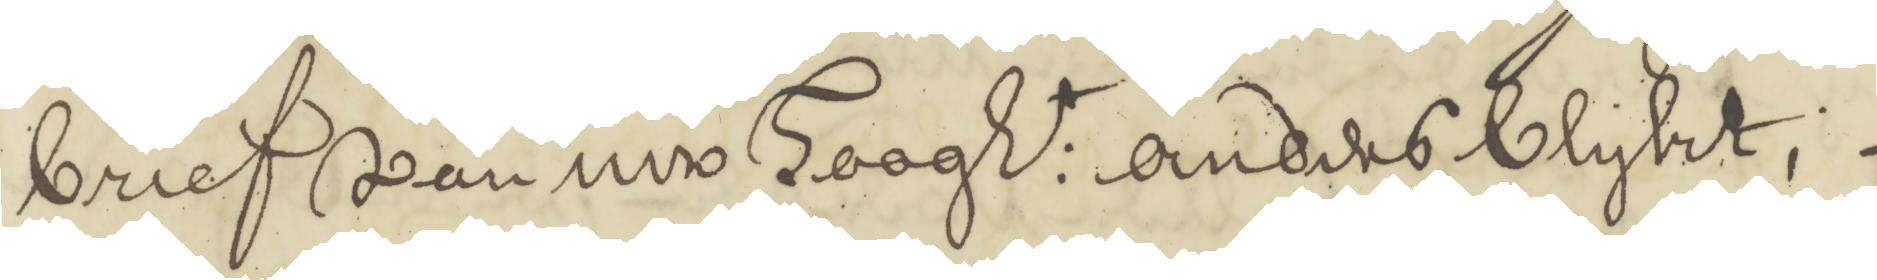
brief van uw hoogh:t anders blijkt,—
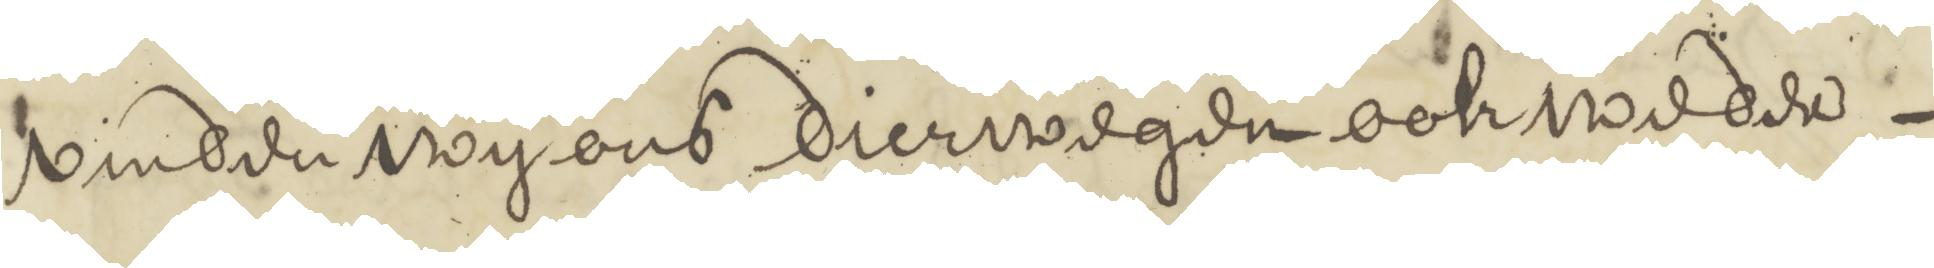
vinden wij ons dierwegen ook weder —
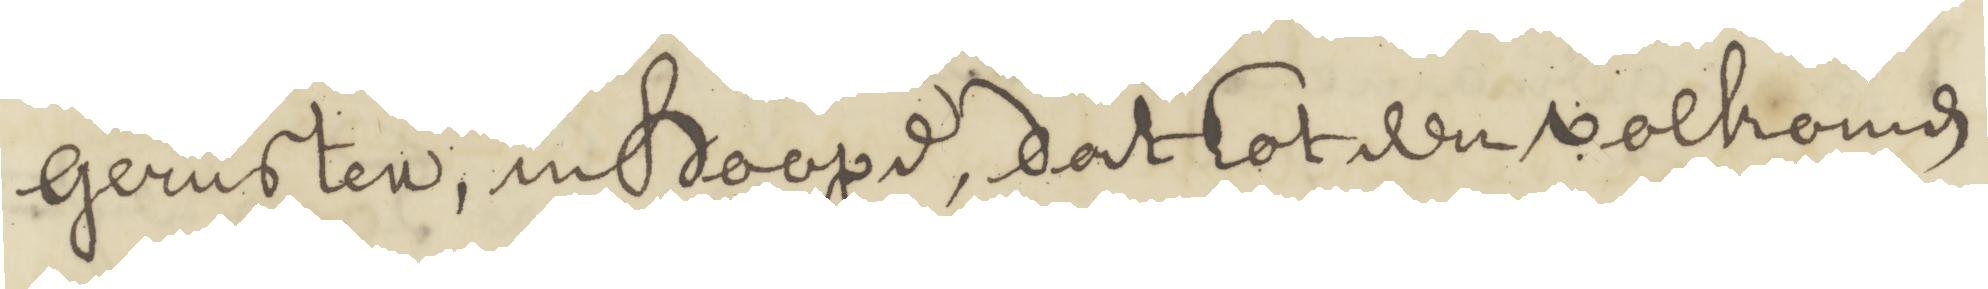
geruster, inHoope, dat tot een volkomen
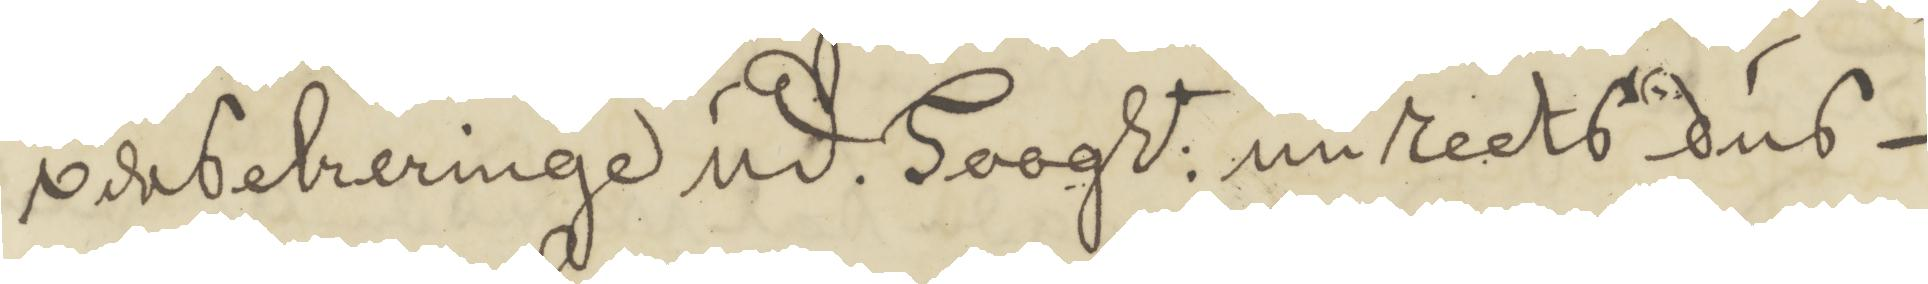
versekeringe uE. hoogh:t nu reets dus —
